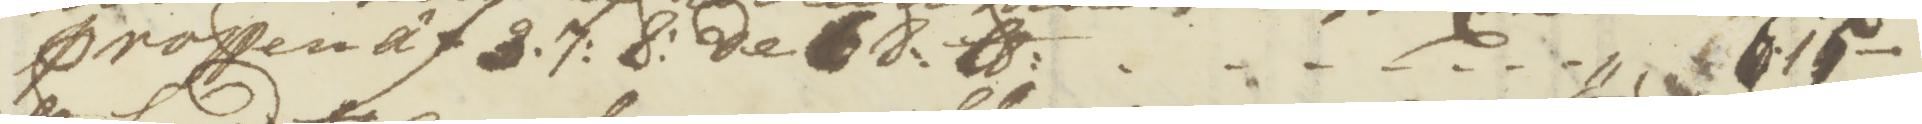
proppen â ƒ 3.7: 8: de 68: lb: „ 6. 15 —
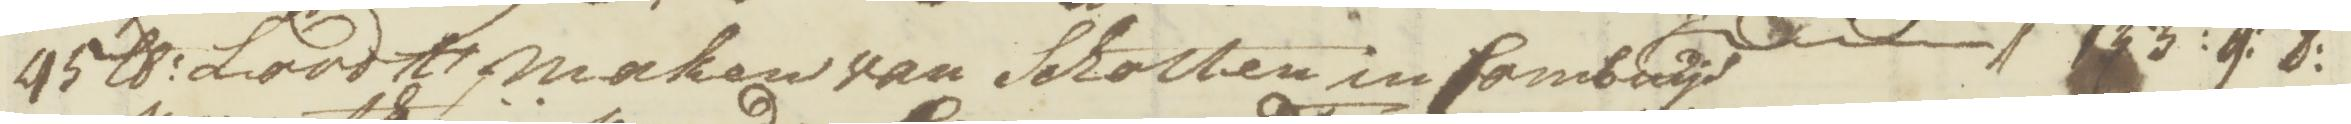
45 lb: Lood t' maken van schotten in Combuijs „ 155: 9 : 8:
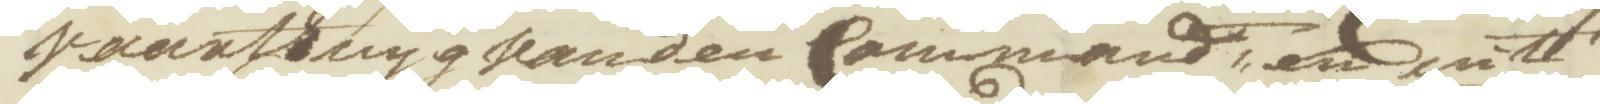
vaarthuijg van den Command„ en intr
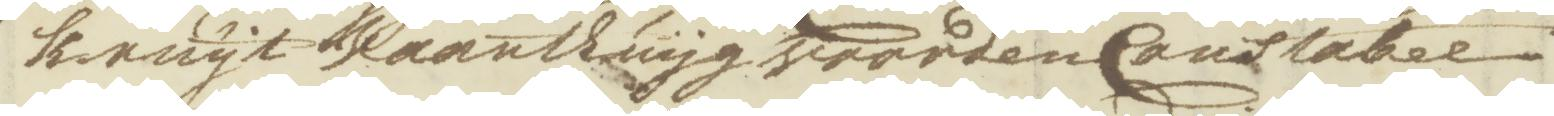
kruijt vaarthuijg voor den Carstabel
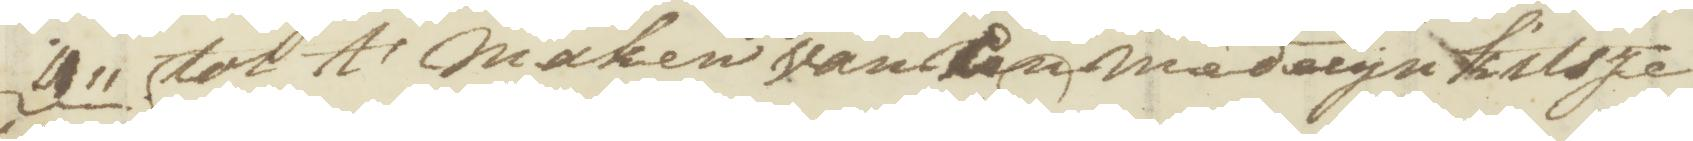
4 „ tot t' maken van Een medezijn kitsje
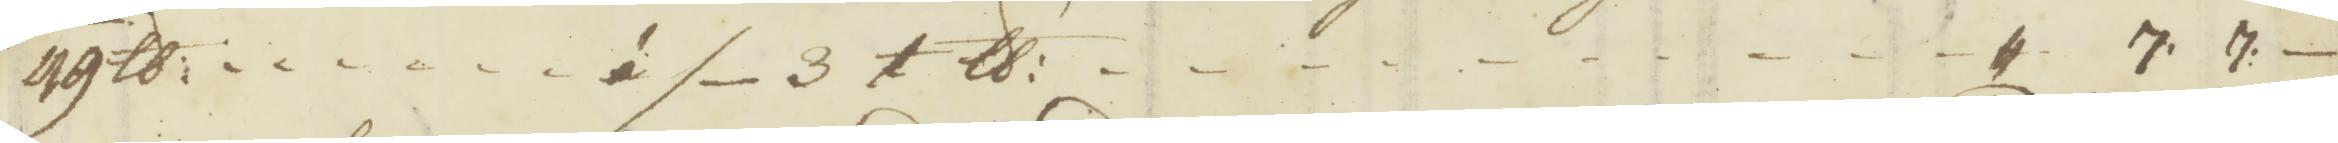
49 lb: â ƒ — 3 t lb: „ 7. 7: —
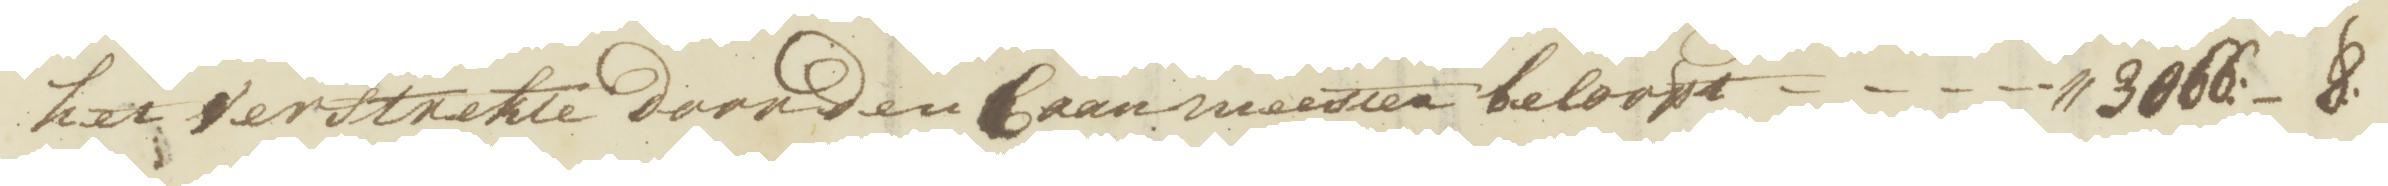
het verstrekte door den Caanmeester beloopt „ 3066: — 8:
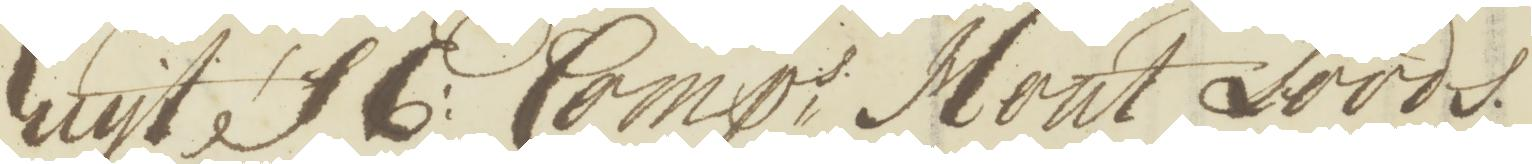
uijt 's E: Comp„s Mout soods.
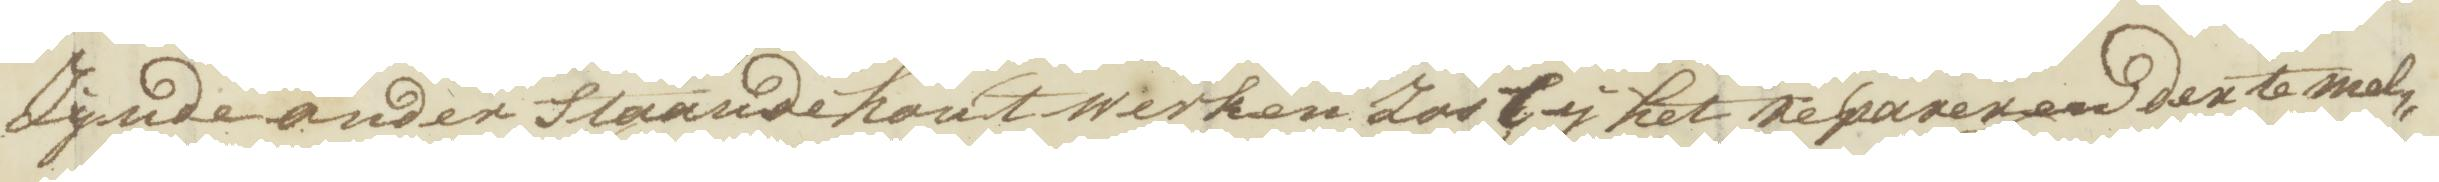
Zijnde ander staande hout werken zoo bij het repareren der te mel„
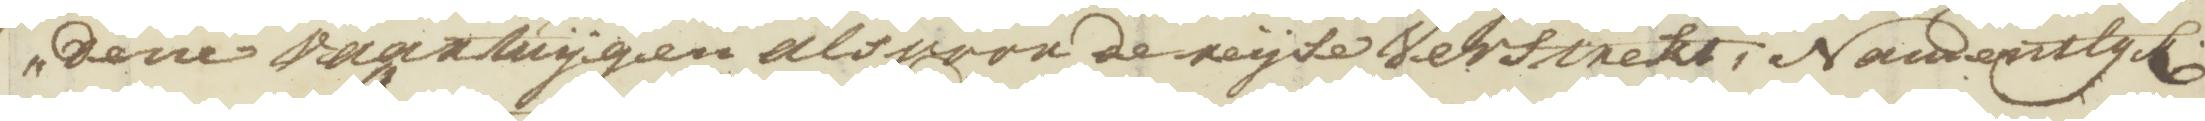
„dene vaartuijgen als voor de reijse verstrekt, Namentlijk
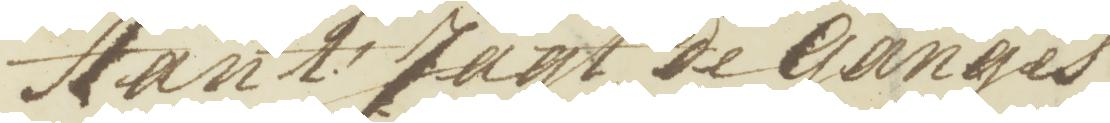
Aan t' Jagt de Ganges
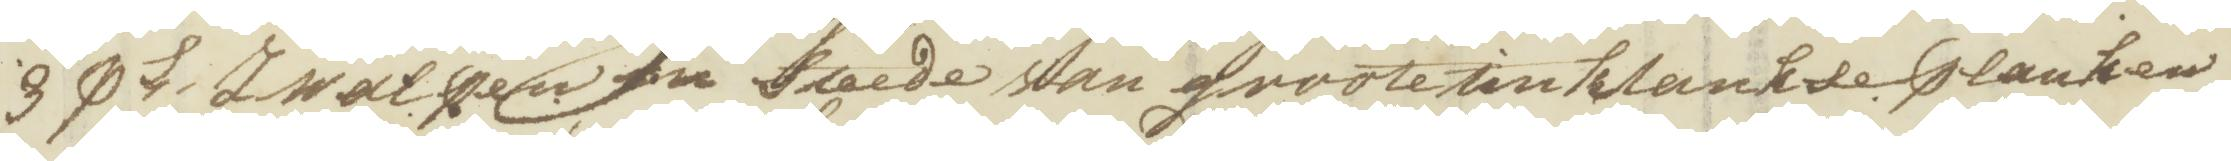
3 p„s zwalpen in steede van groote ten klankse planken
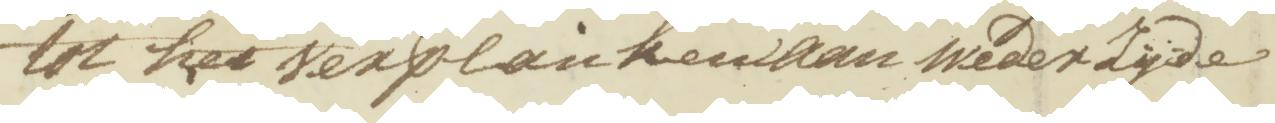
tot het verplanken aan weder zijde
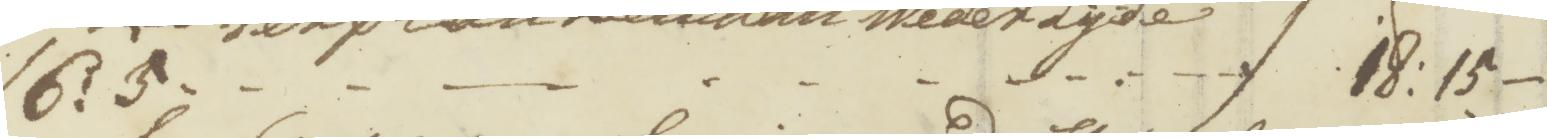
ƒ 6: 5 ƒ 18: 15 —
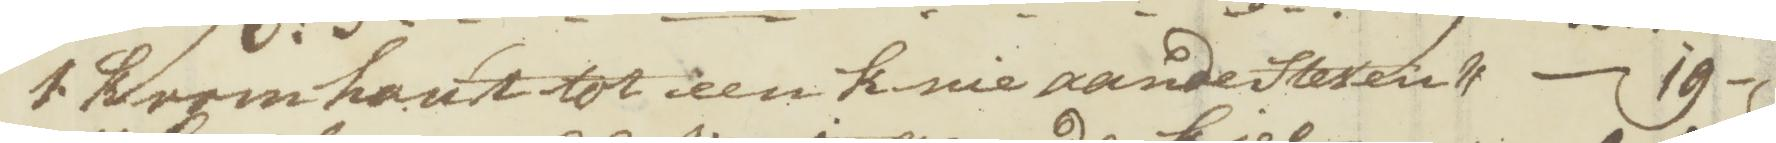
1 krom hout tot een krie aande steren „ — 19 —
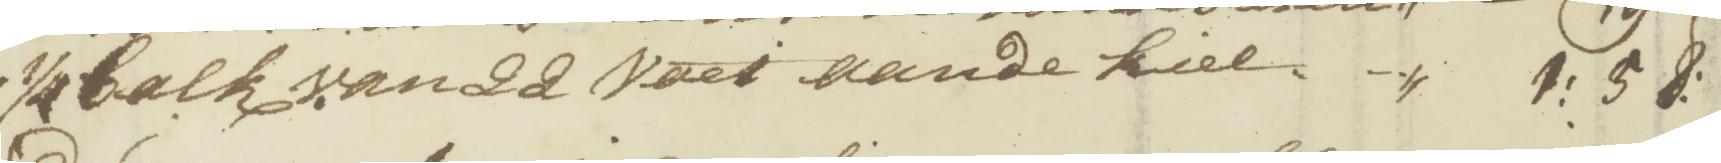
— ¼ balk van 22 vaet aan de kiel „ 1: 5 8:
